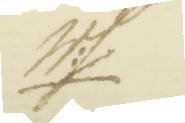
W:S
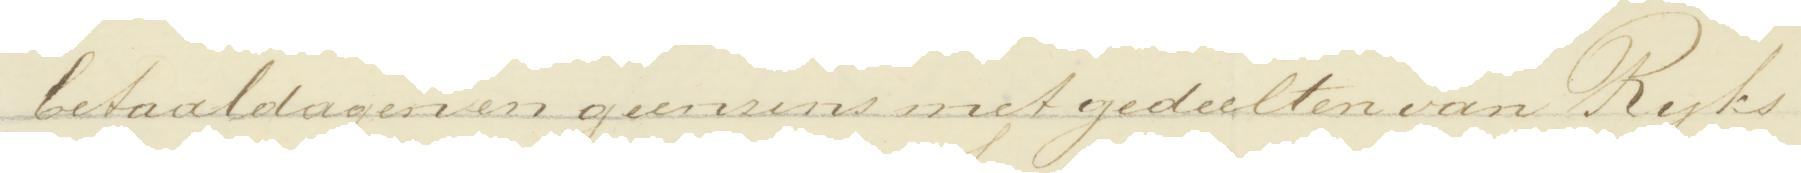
betaaldagen en geenzins met gedeelten van Ryks
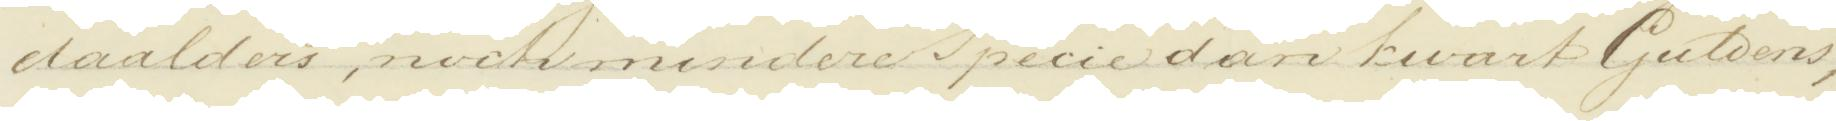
daalders, noch mindere specie dan kwart Guldens,
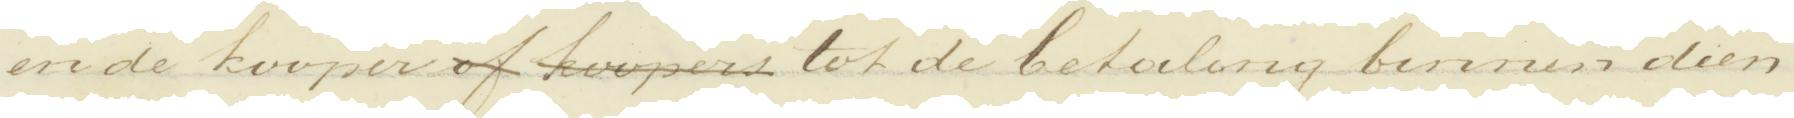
en de kooper of koopers tot de betaling binnen dien
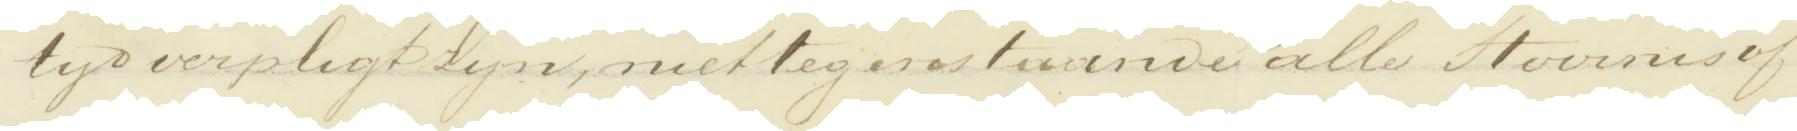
tyd verpligt zyn, niet tegenstaande alle Stoornis of
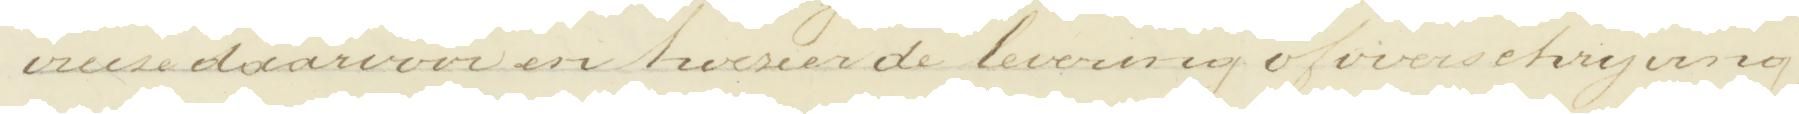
vreeze daarvoor en hoezeer de levering of overschryving
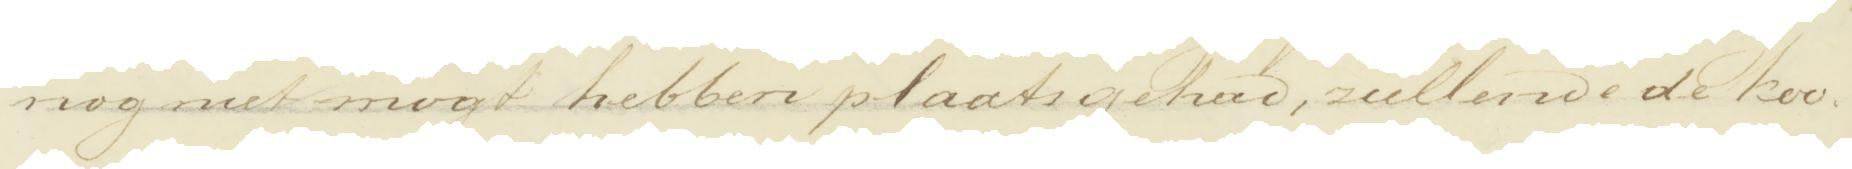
nog niet mogt hebben plaatsgehad, zullende de koo„
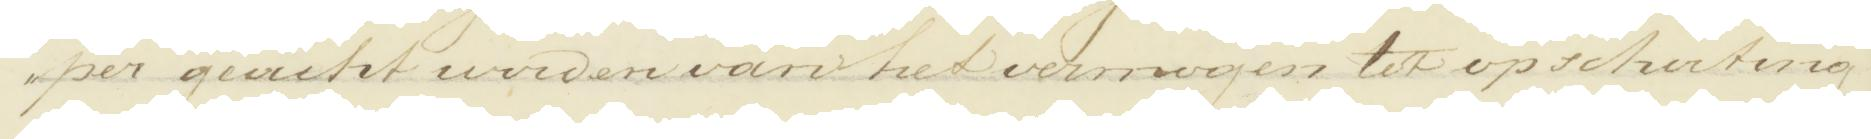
„per geacht worden van het vermogen tot opschorting
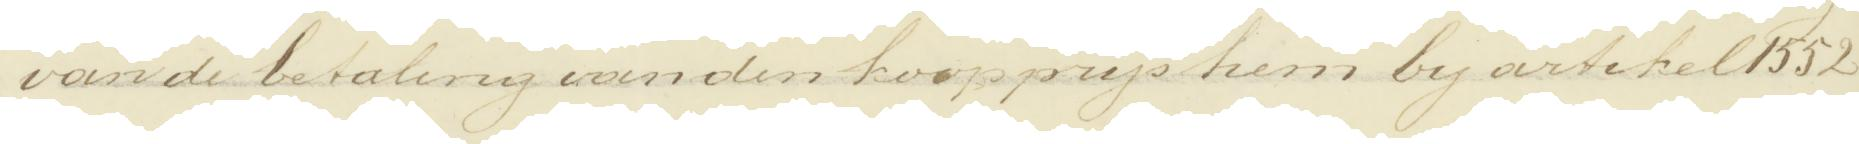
van de betaling van den koopprys hem by artikel 1552
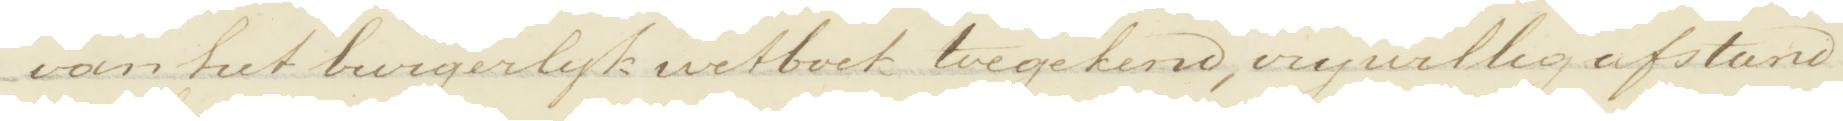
van het burgerlyk wetboek toegekend, vrywillig afstand
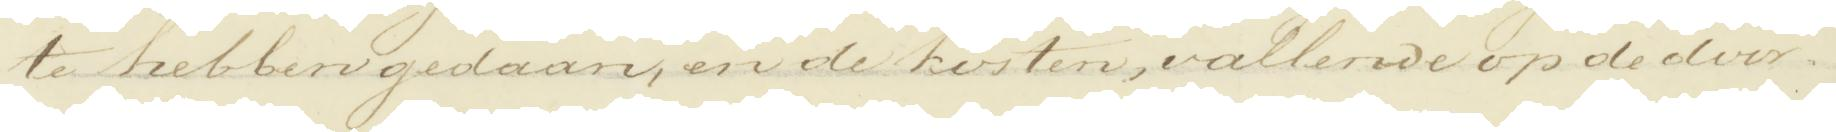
te hebben gedaan, en de kosten vallende op de door„
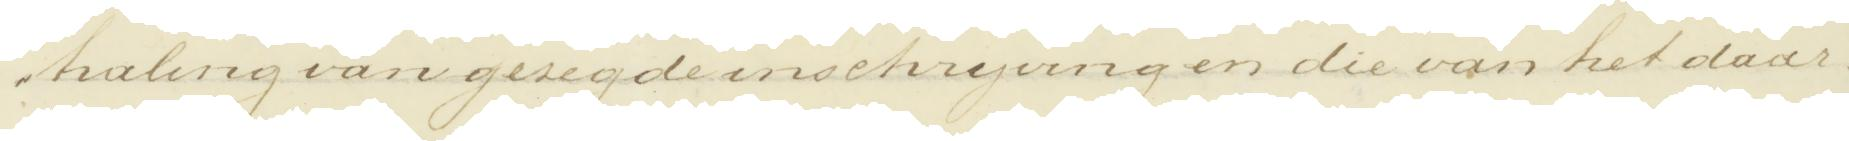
„haling van gezegde inschryving en die van het daar
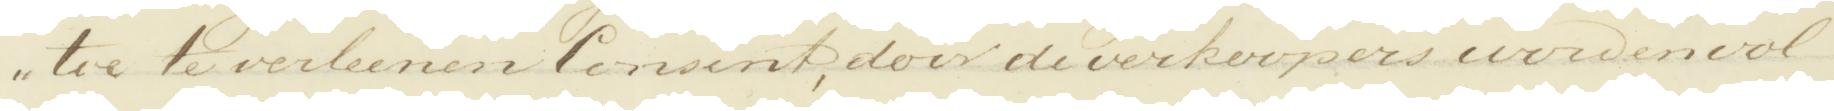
„toe te verleenen Consent door de verkoopers worden vol
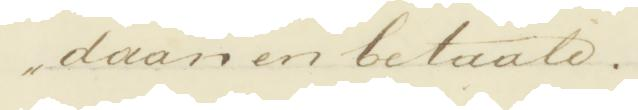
„daan en betaald.
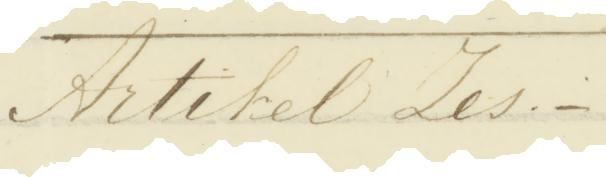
Artikel zes.-
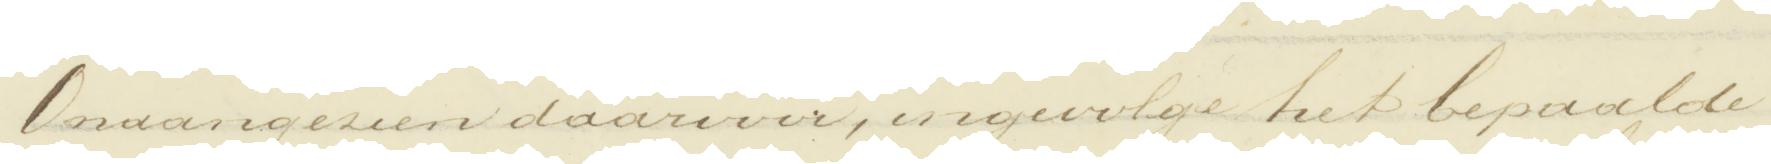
Onaangezien daarvoor, ingevolge het bepaalde
